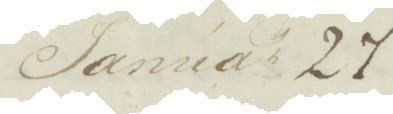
Janua„y 27
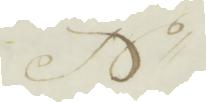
N„o
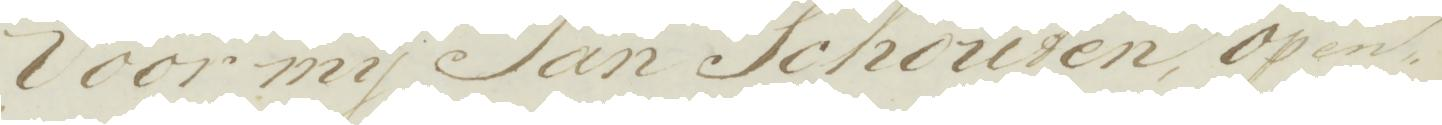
Voor mij Jan Schouten, open„
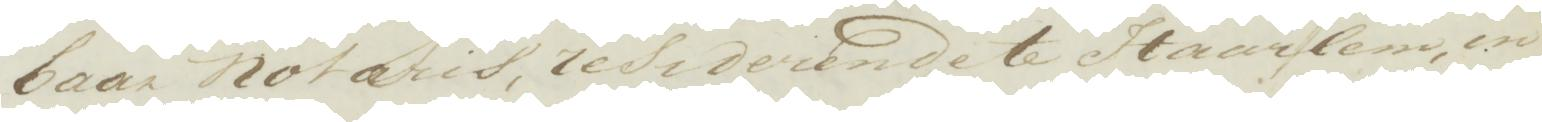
baar Notaris, residerende te Haarlem, in
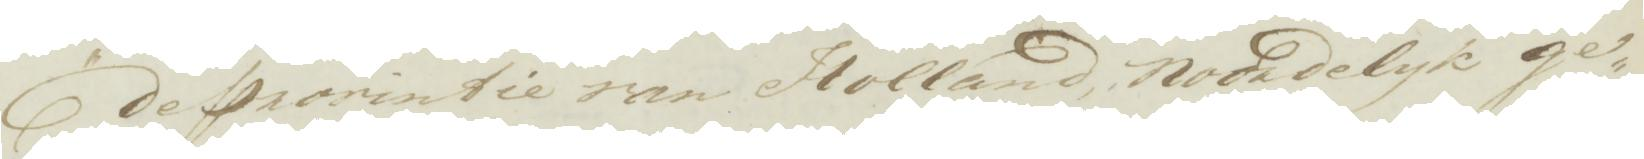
de provintie van Holland, Noordelyk ge„
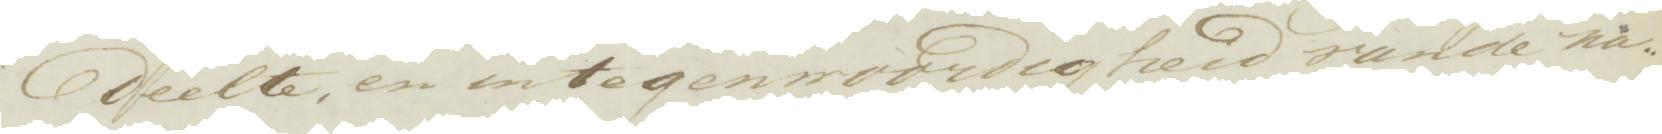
deelte, en in tegenwoordigheid van de na„
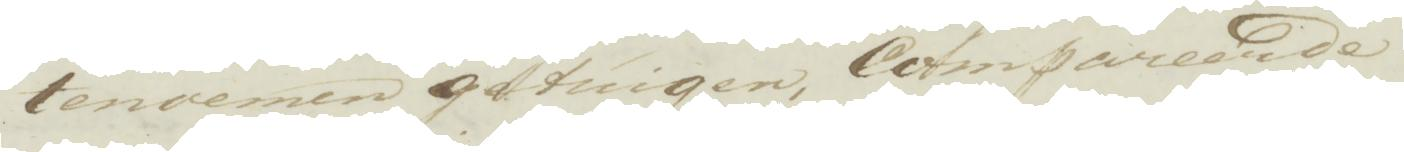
tenoemen getuigen, Compareerde
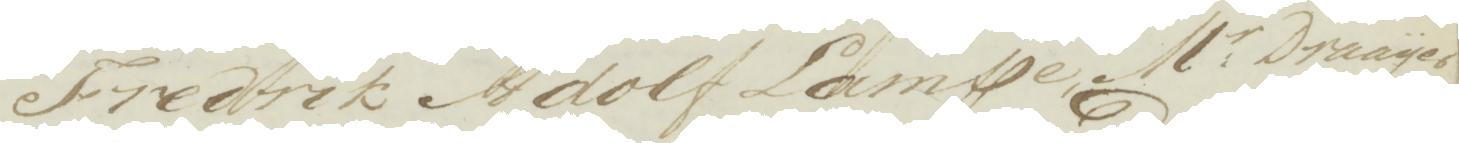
Fredrik Adolf Lampe, M:r Draaijer
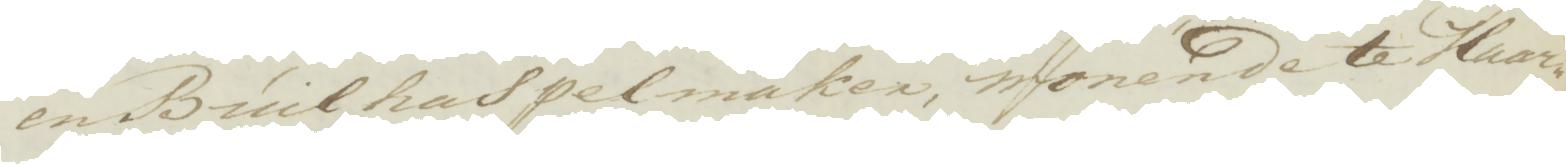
en Buil haspelmaker, wonende te Haar„
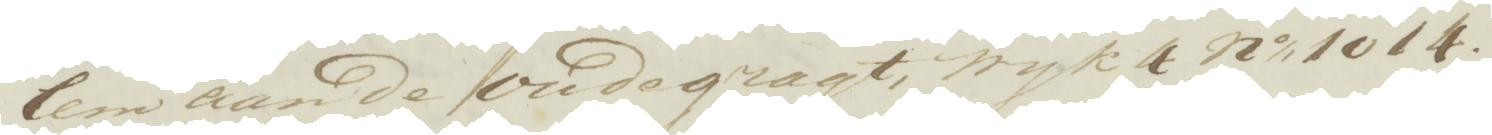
lem aan de oude gragt, wijk 4 N„o 1014.
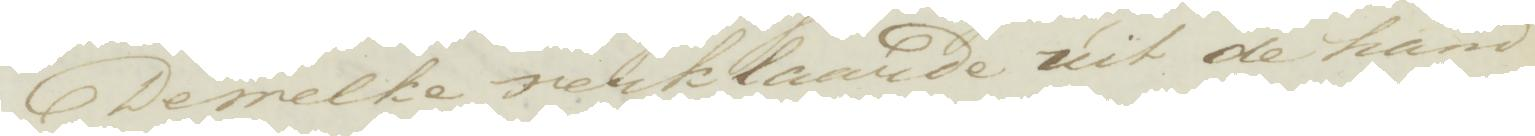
Dewelke verklaarde uit de hand
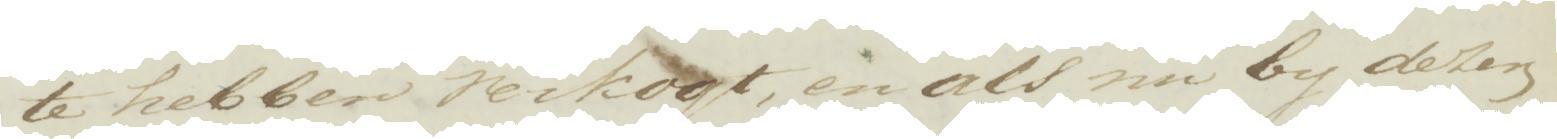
te hebben verkogt, en als nu by dezen
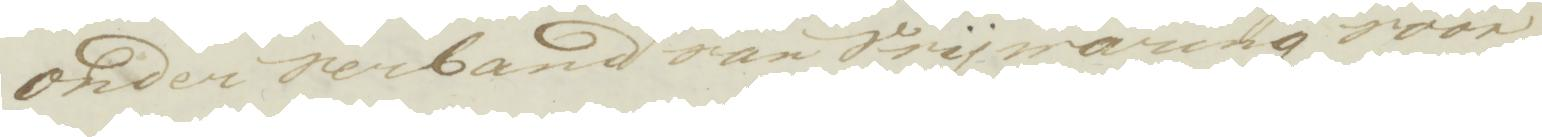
onder verband van vrijwaring voor
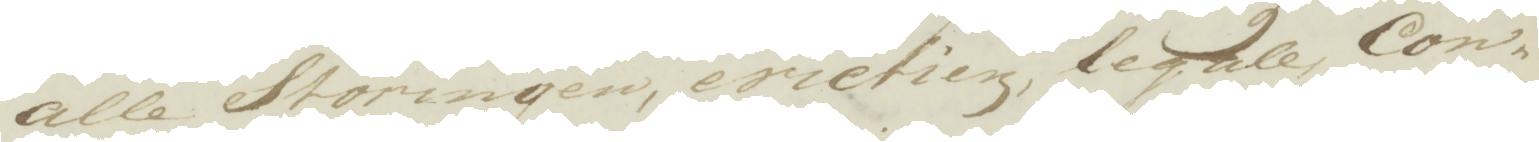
alle storingen, evictien, legale, Con„
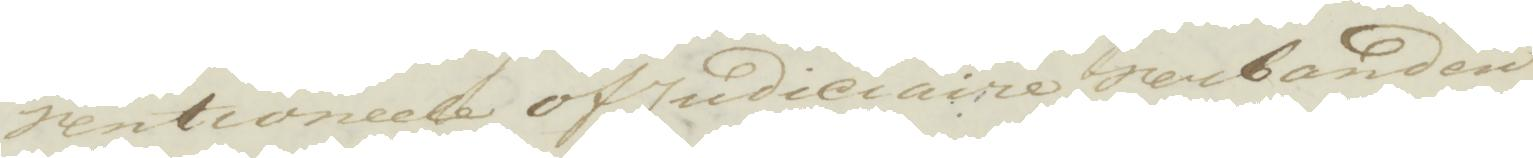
ventioneele of Judiciaire verbanden
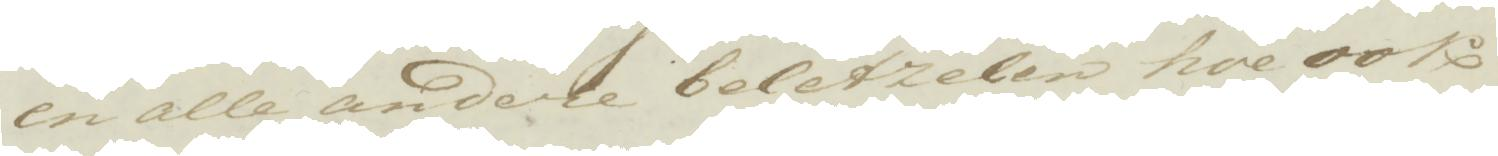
en alle andere beletzelen hoe ook
